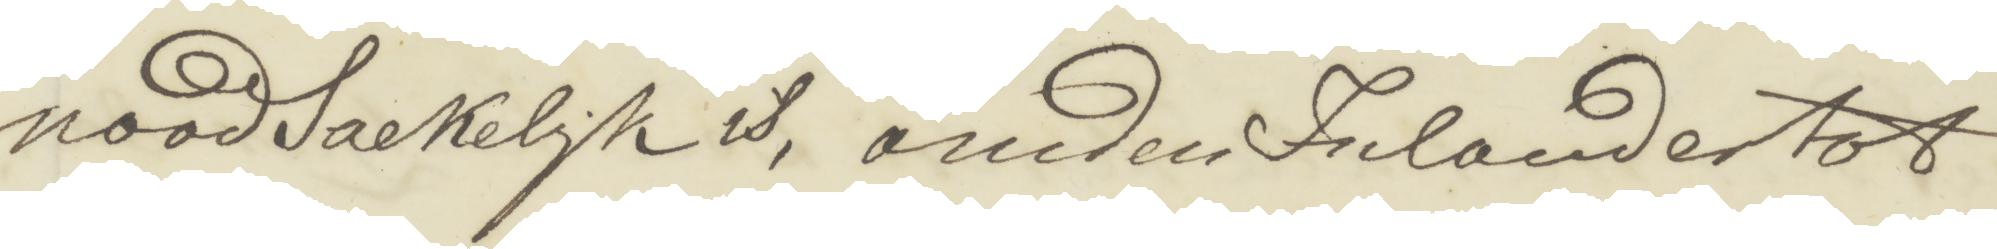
noodsaekelijk is, om den Jnlander tot
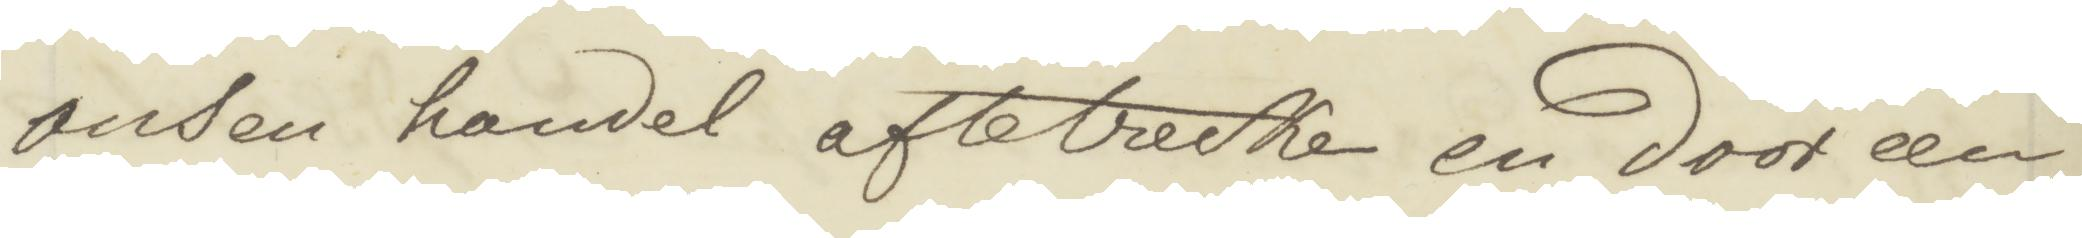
onsen handel aftetrecke en door een
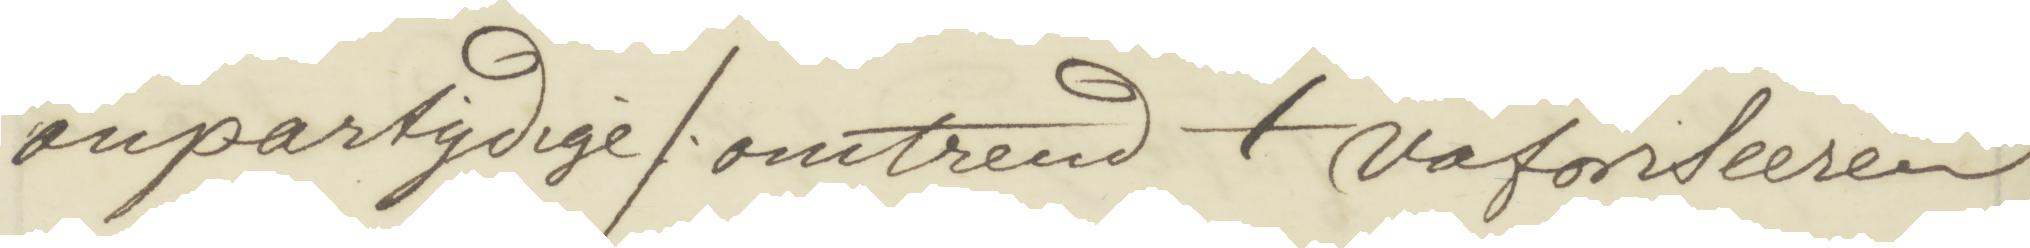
onpartijdige /: omtrend ’t vaforiseeren
